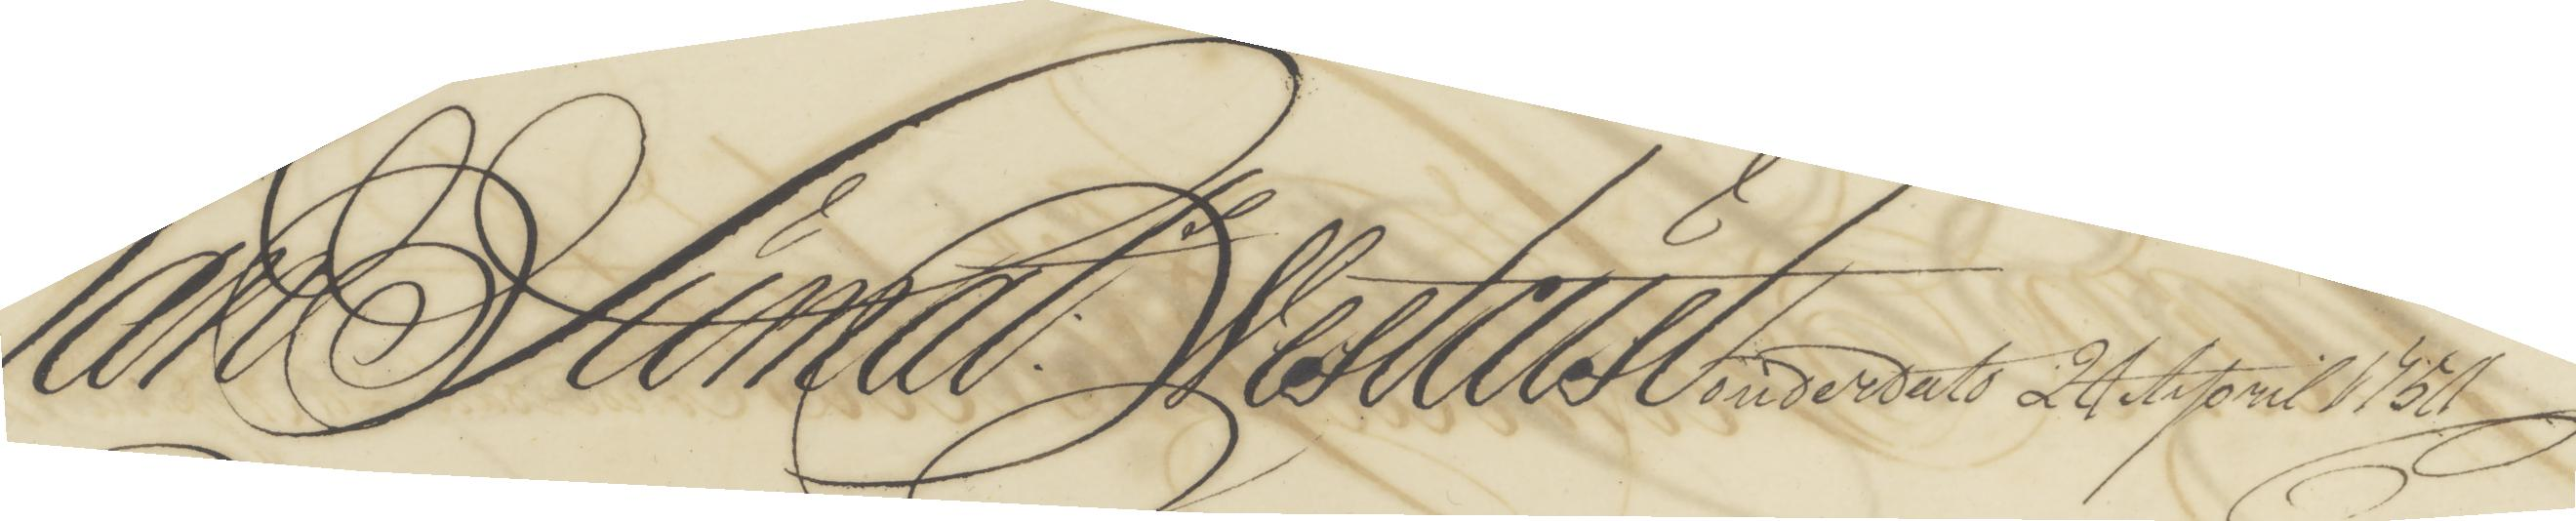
Van Sumat:s westcust onderdato 24 April 1754.
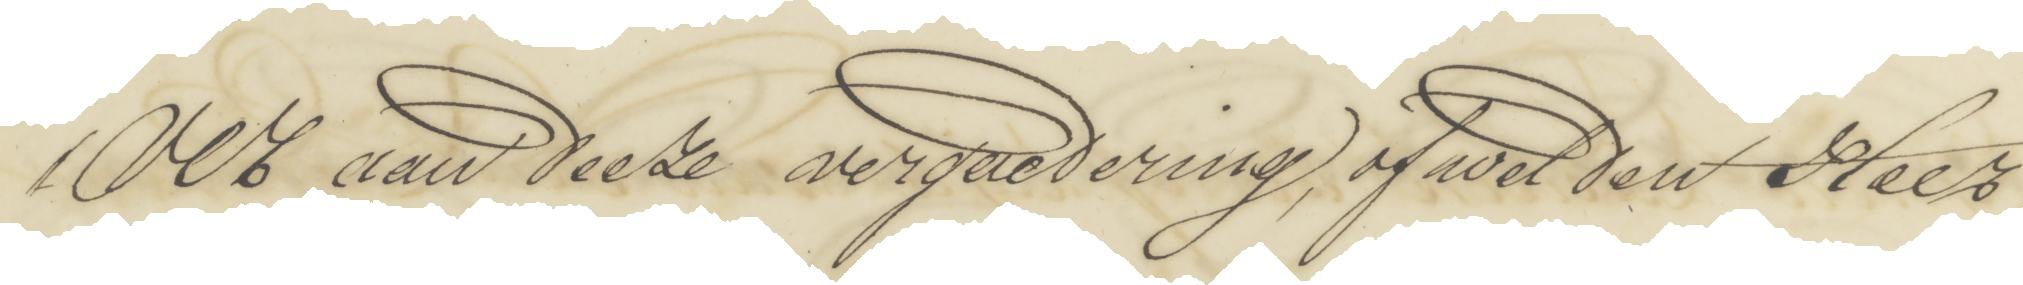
Ver aan deeze vergaedering, of wel den Heer
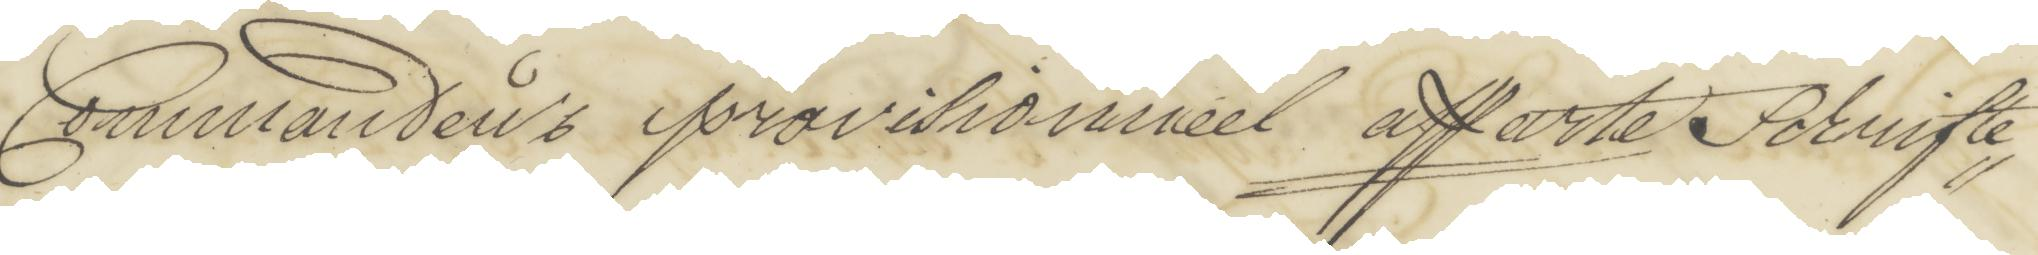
Commandeur provisionneel affarte Schrifte„
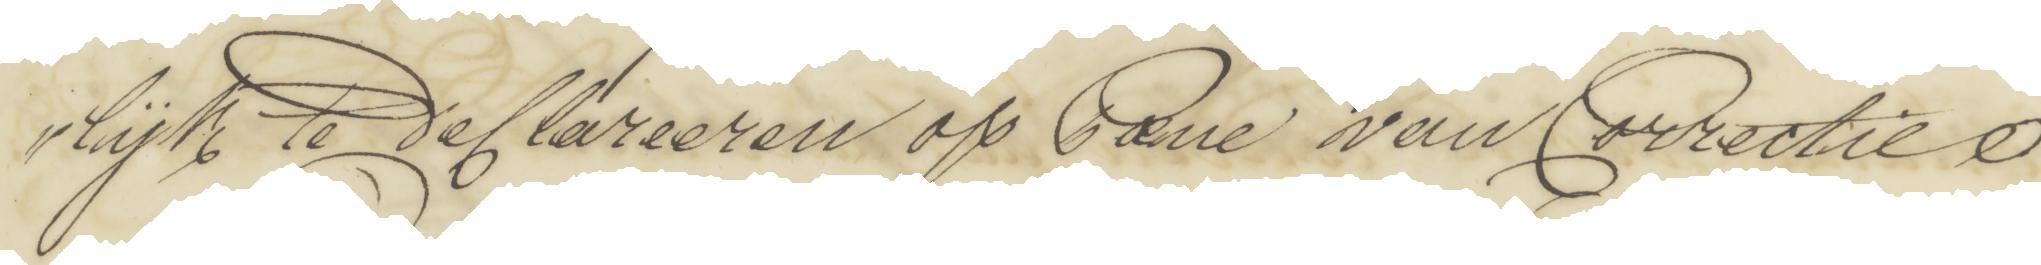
lijk te declareeren op Poene van Correctie
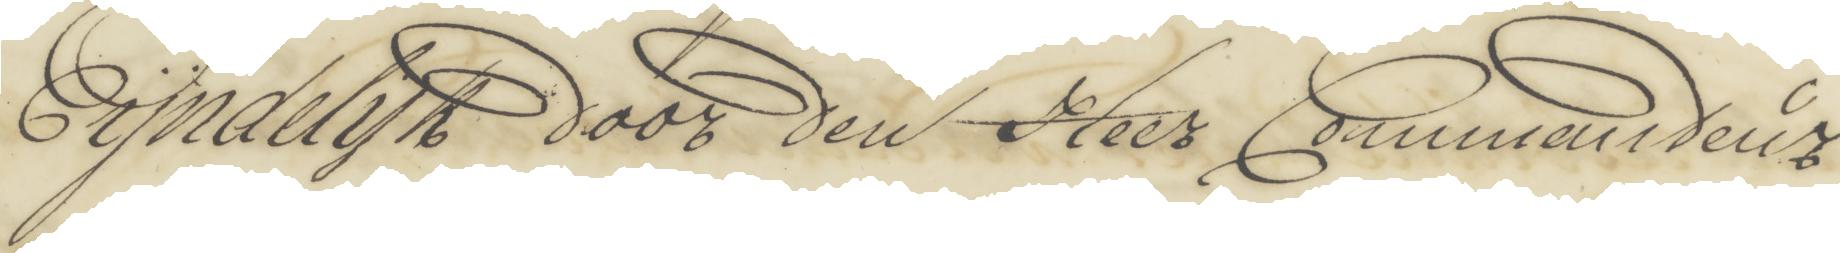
Eijndelijk door den Heer Commandeur
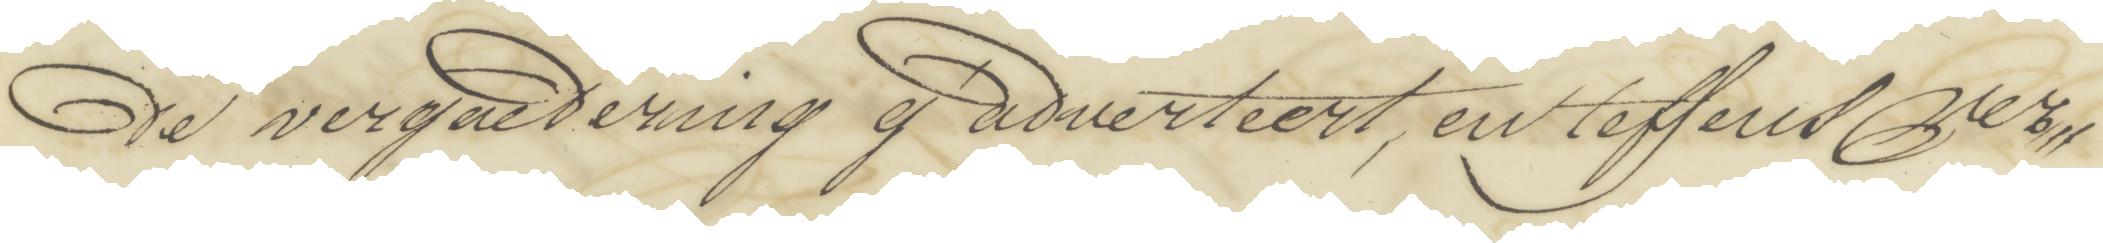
de vergaedering g’adverteert, en teffens ver„
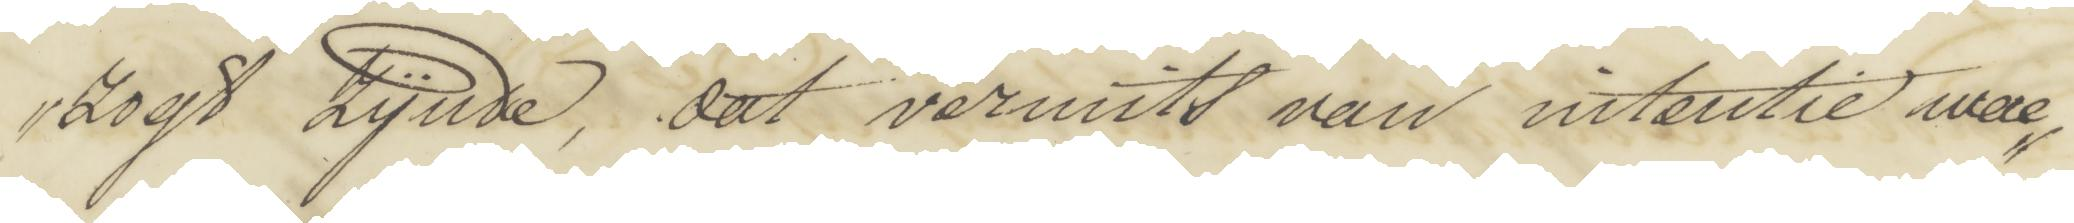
zogt zijnde, .dat vermits van intentie wae„
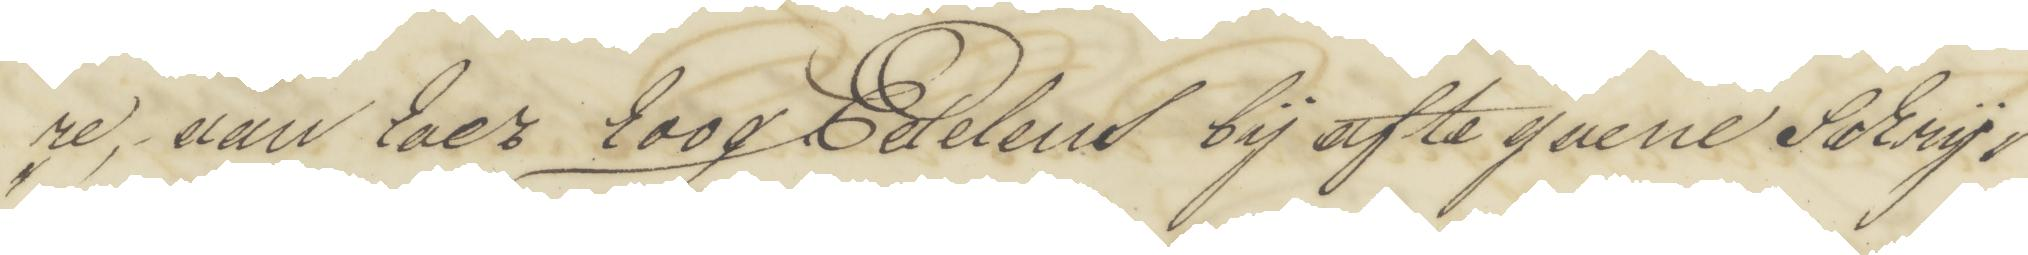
re, aan haer hoog Edelens bij af te gaene Schrij
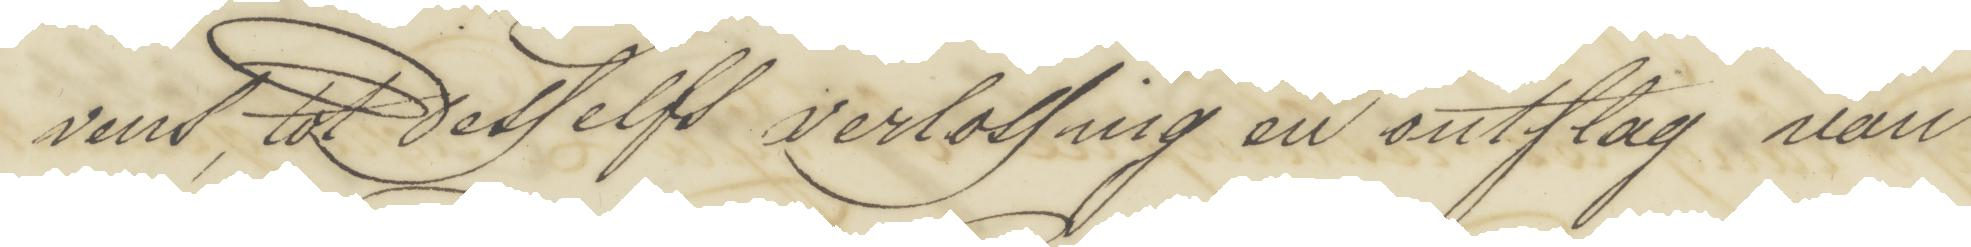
vens, tot desselfs verlossing en ontslag van
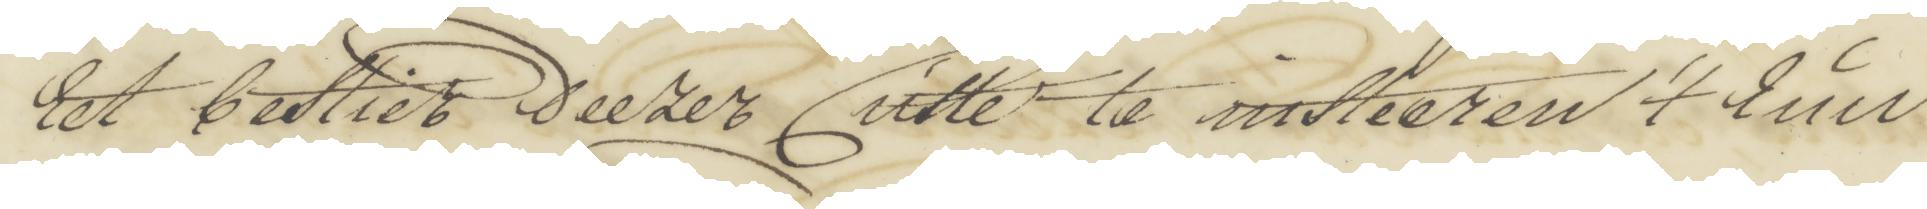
het bestier deezer Custe te insteeren ’t hun
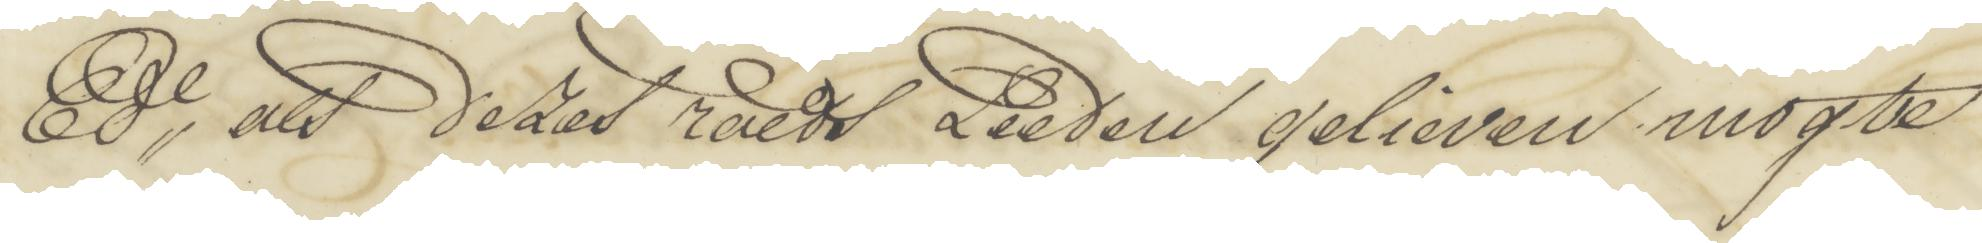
Ed„l als dezes raeds Leeden gelieven mogte
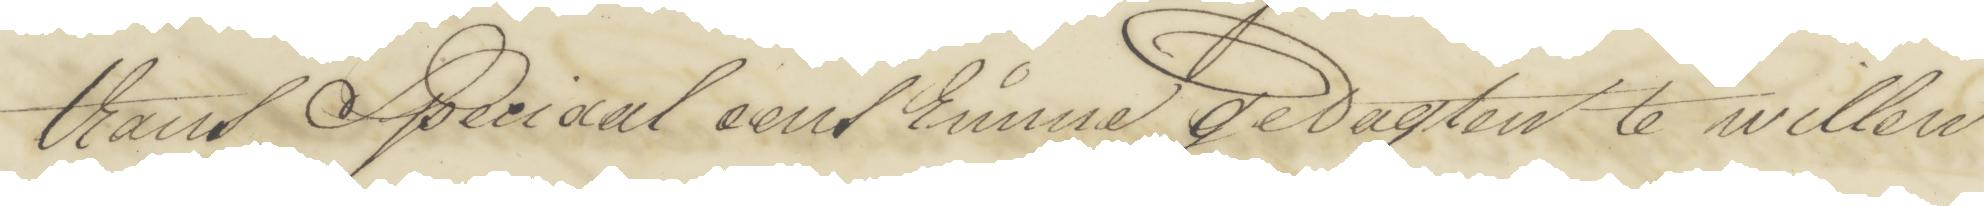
thans Speciaal eens hunne gedagten te willen
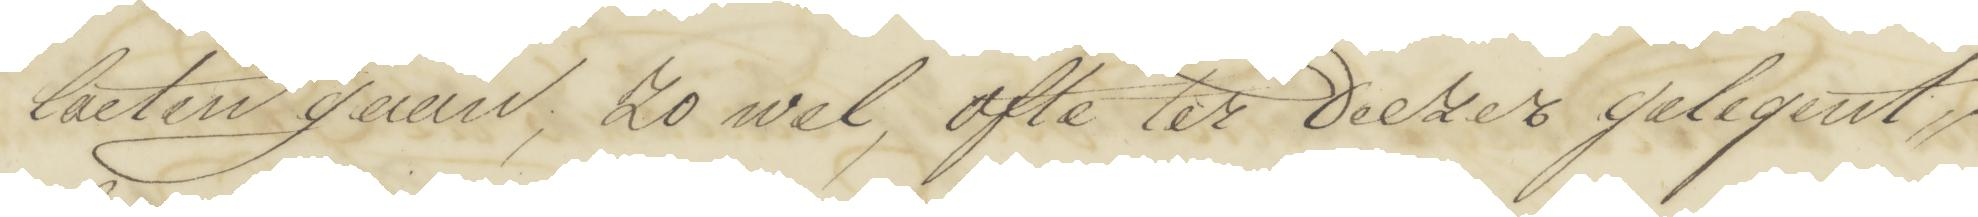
laeten gaan; zo wel, ofte ter deezer gelegent„
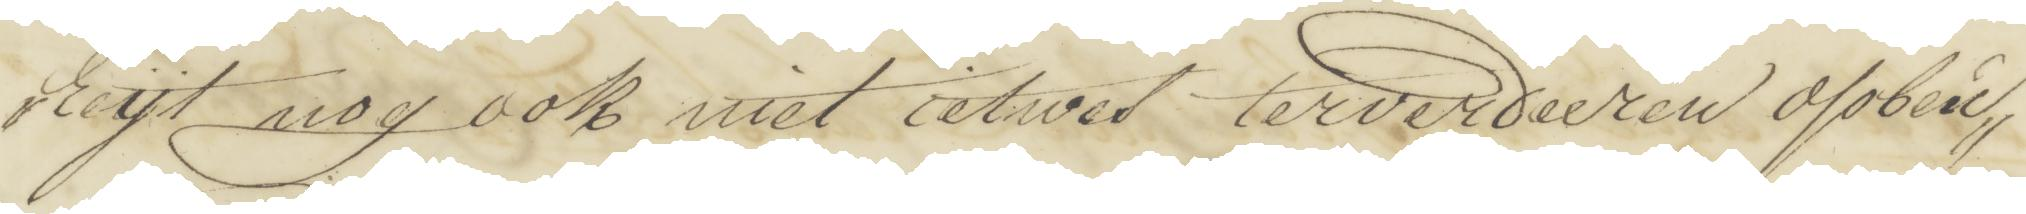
heijt nog ook niet ietwes terverdeeren opbeu„
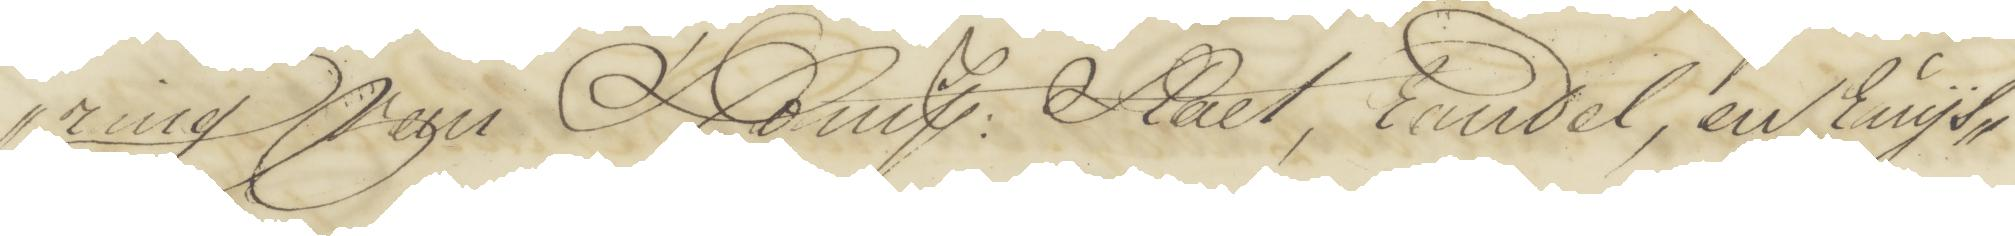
ring van 'S Comp:s Staet, handel, en huijs„
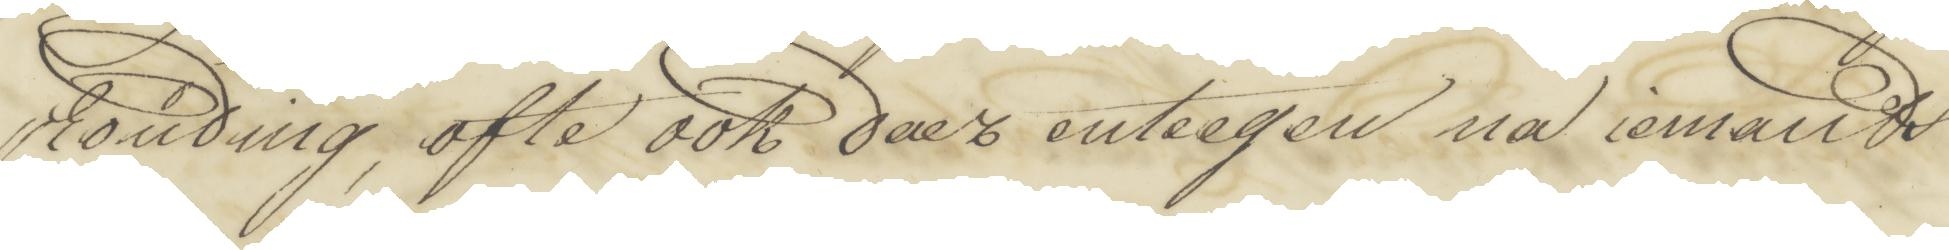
„houding, ofte ook daer enteegen na iemands
